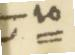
=to
